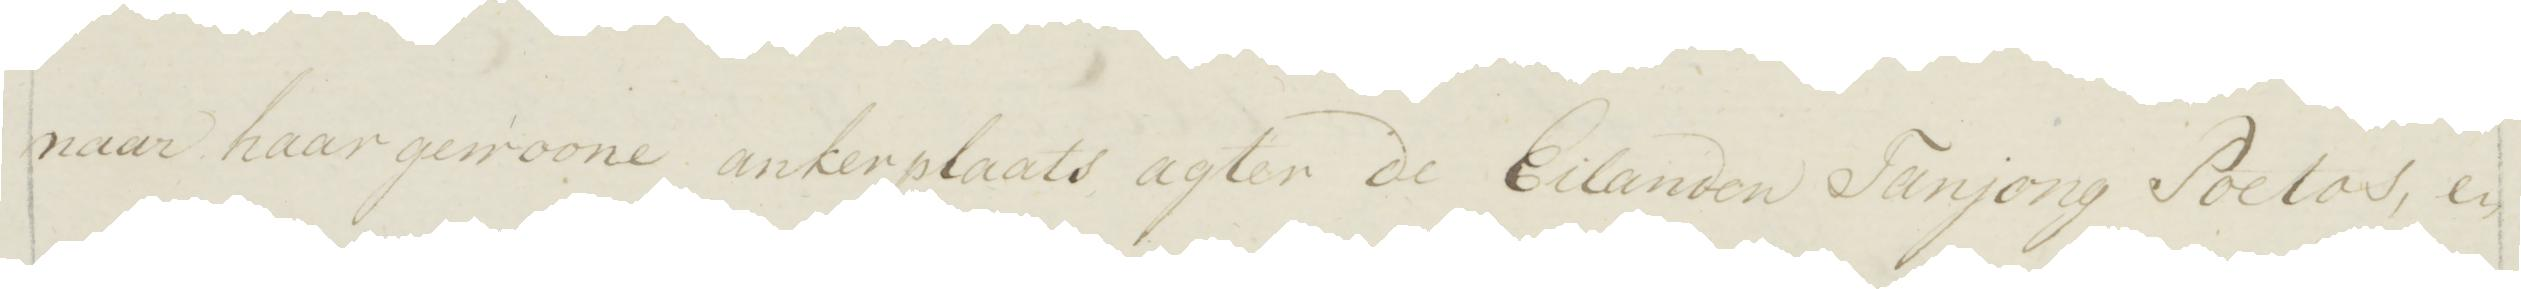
naar haar gewoone ankerplaats agter de Eilanden Tanjong Poetos, en
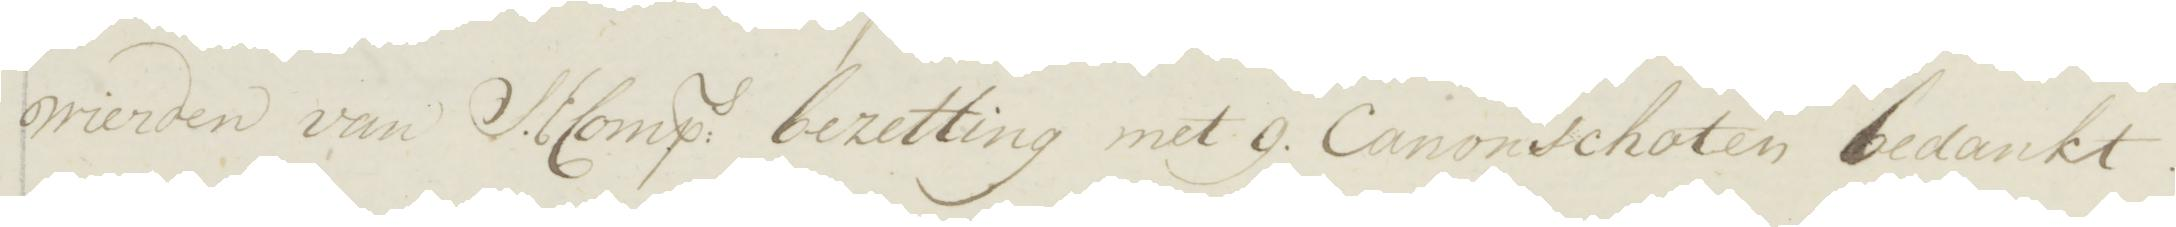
wierden van S.EComp:s bezetting met 9. Canonschoten bedankt
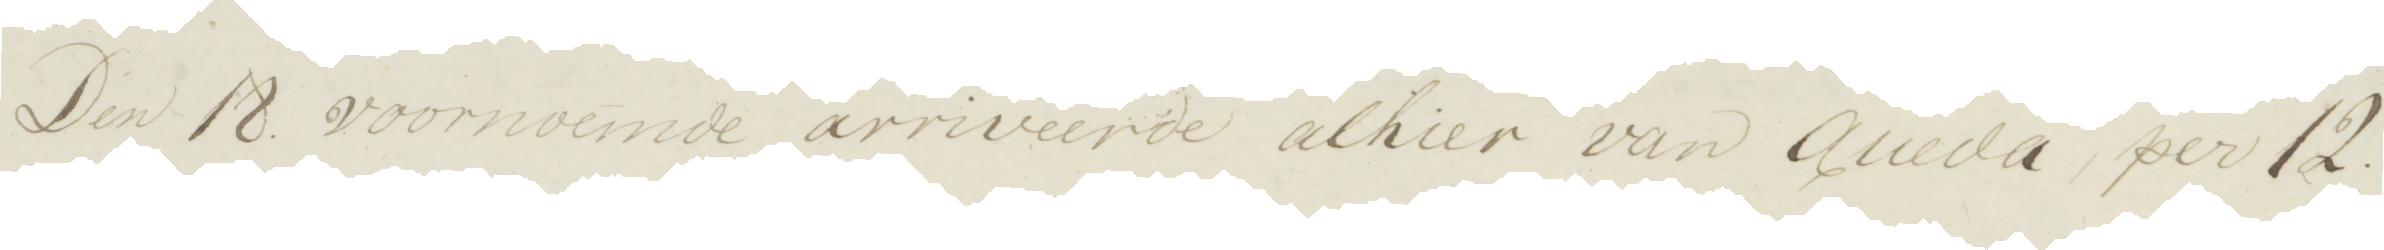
Den 18. voornoemde arriveerde alhier van queda, per 12.
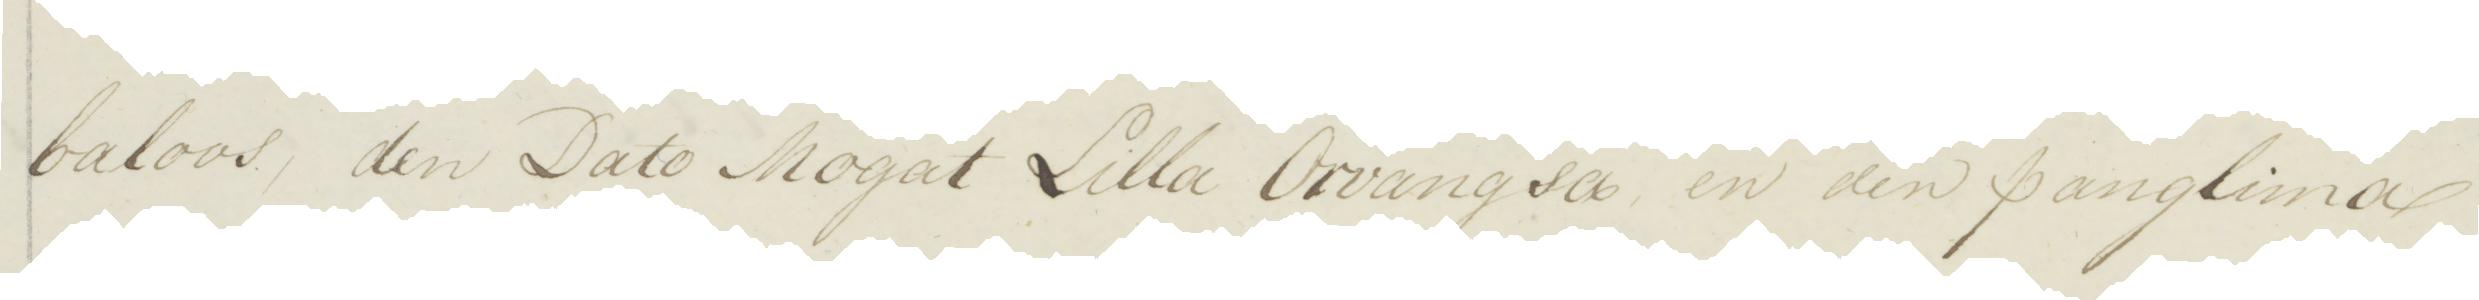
baloos, den Dato Mogat Lilla Orvangsa, en den panglima
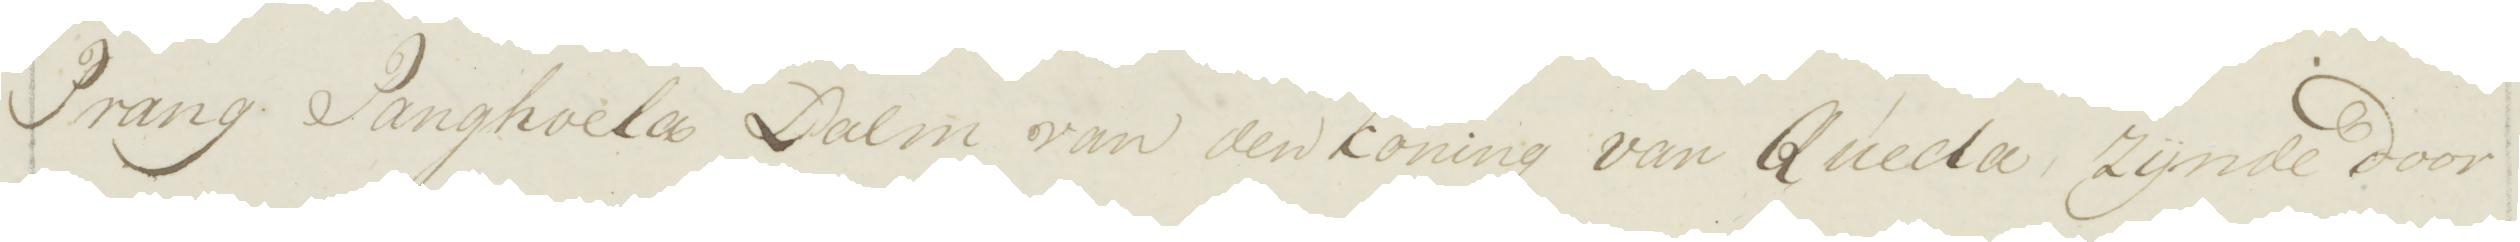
Prang. Panghoela Dalm van den koning van Queda, zijnde door
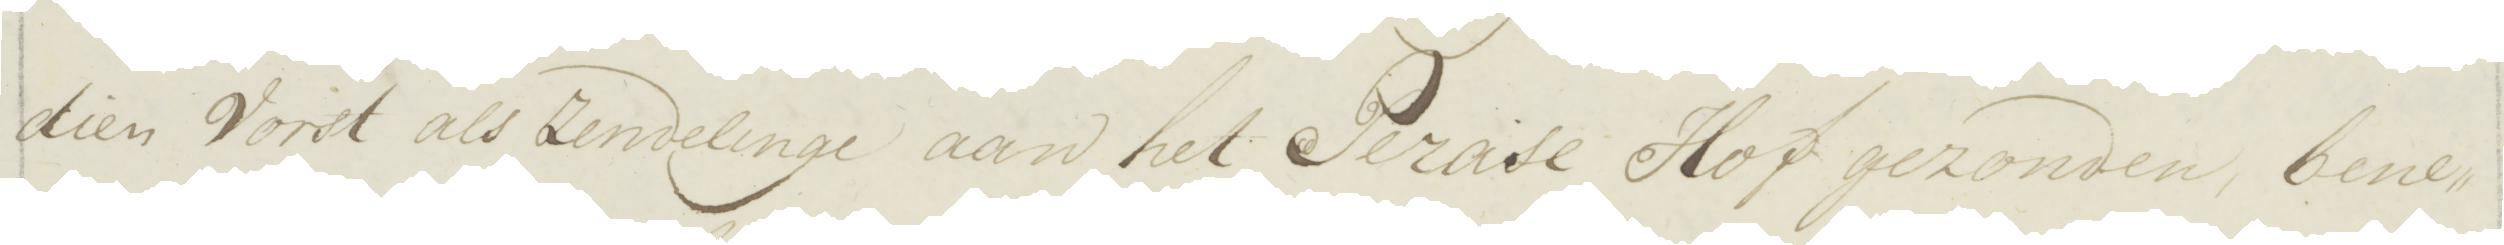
dien vorst als zendelinge aan het Perase Hof gezonden, bene„
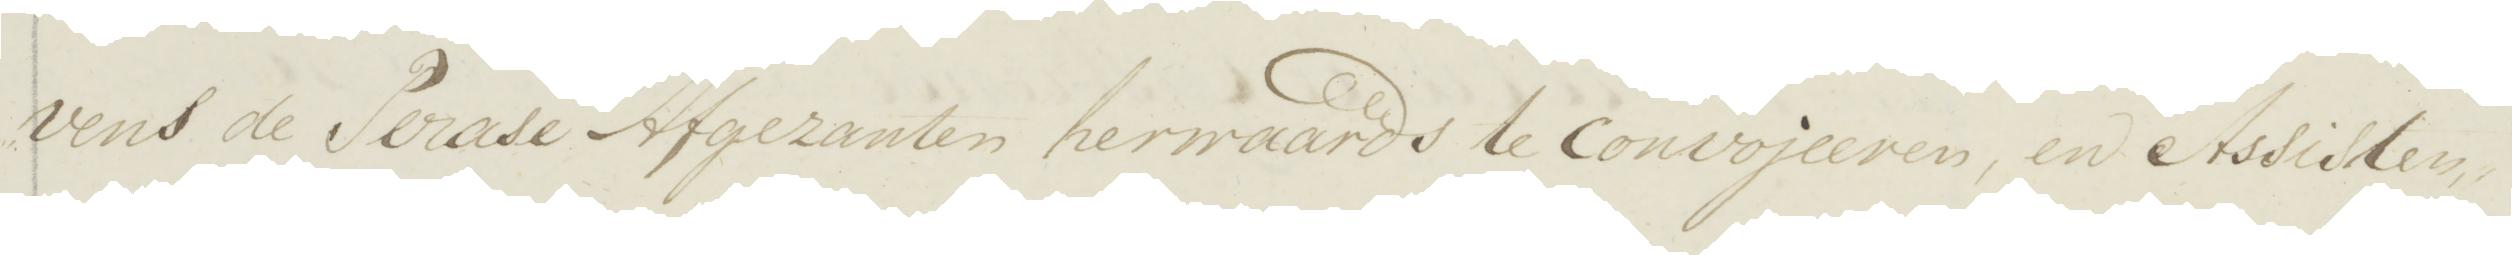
„vens de Perase Afgezanten herwaards te convojeeren, en Assisten„
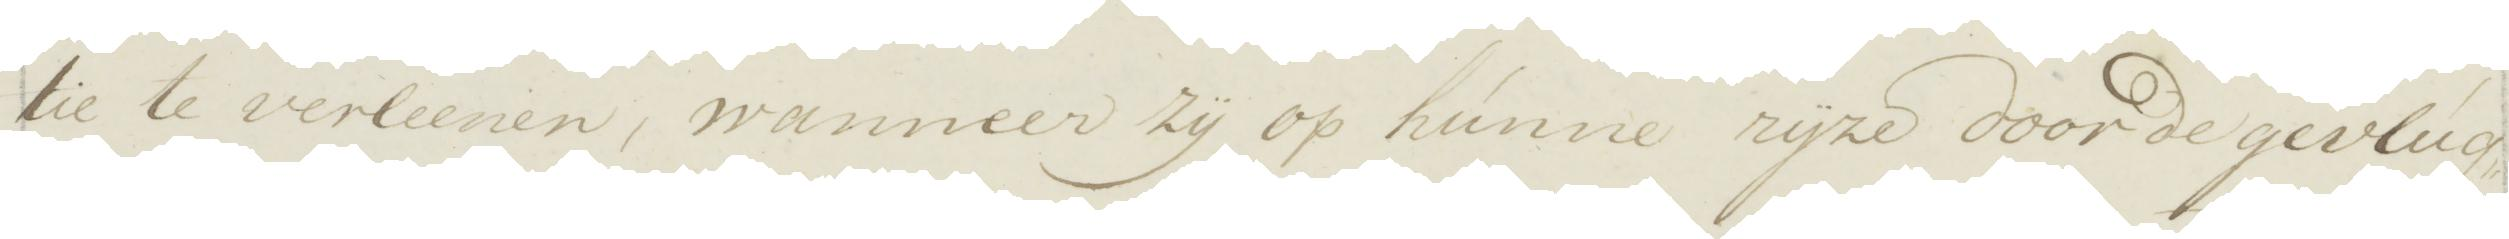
tie te verleenen, wanneer zij op hunne rijze door de gevlug„
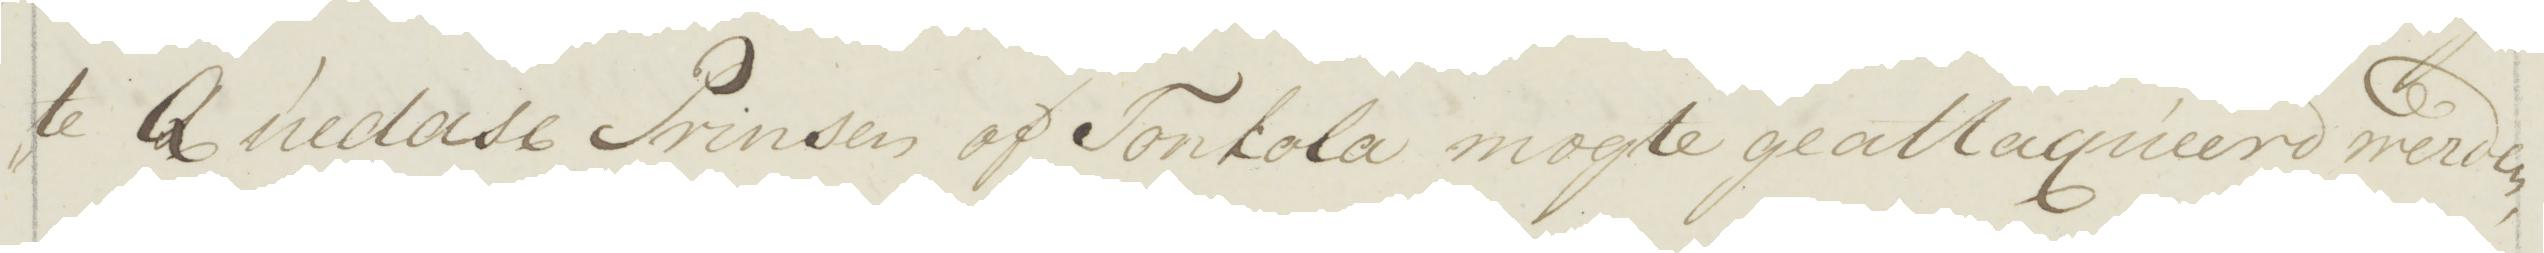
„te Quedase Prinsen of Tonkola mogte geattaqueerd werden,
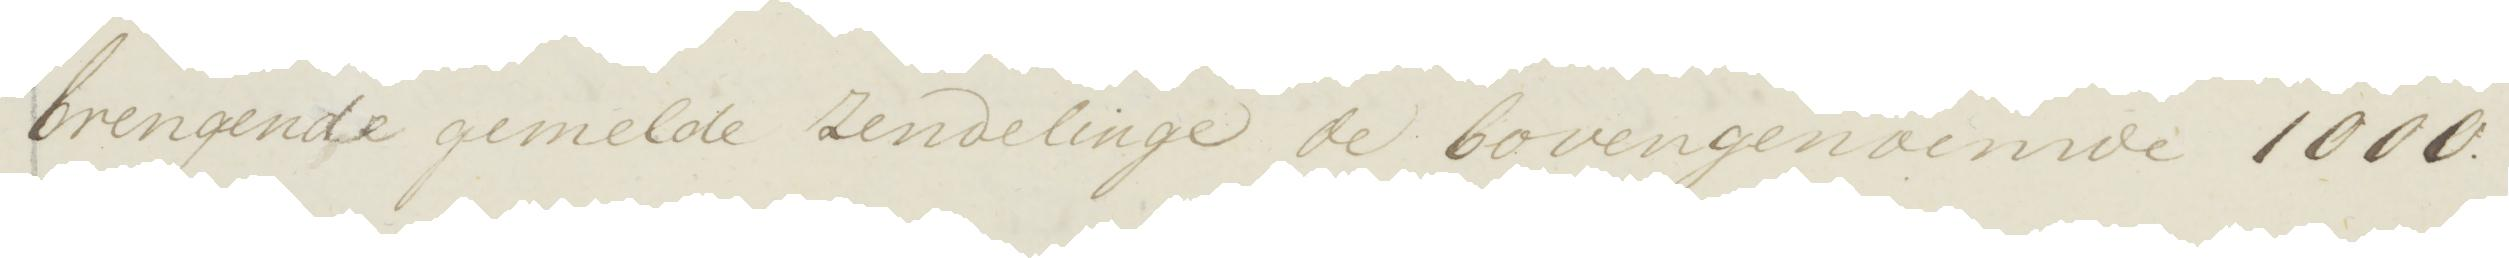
brengende gemelde zendelinge de bovengenoemde 1000.
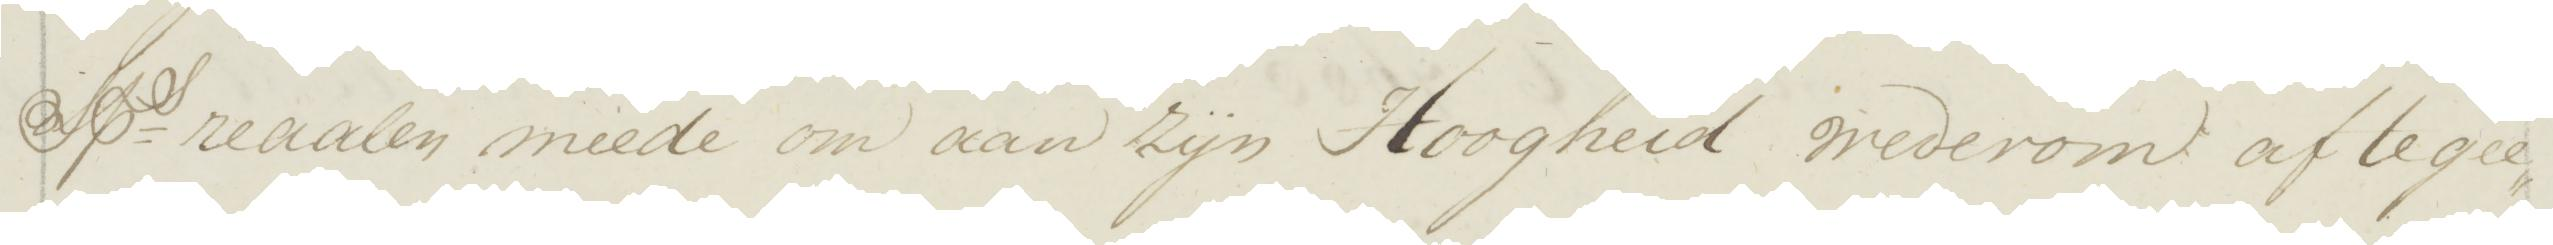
Sp=s reaalen meede om aan zijn Hoogheid wederom af te gee„
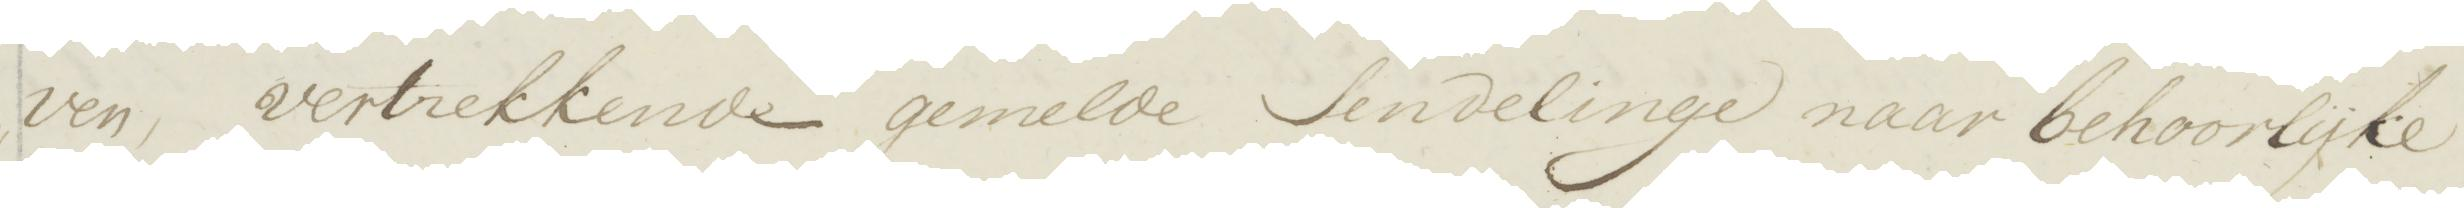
„ven, vertrekkende gemelde sendelinge naar behoorlijke
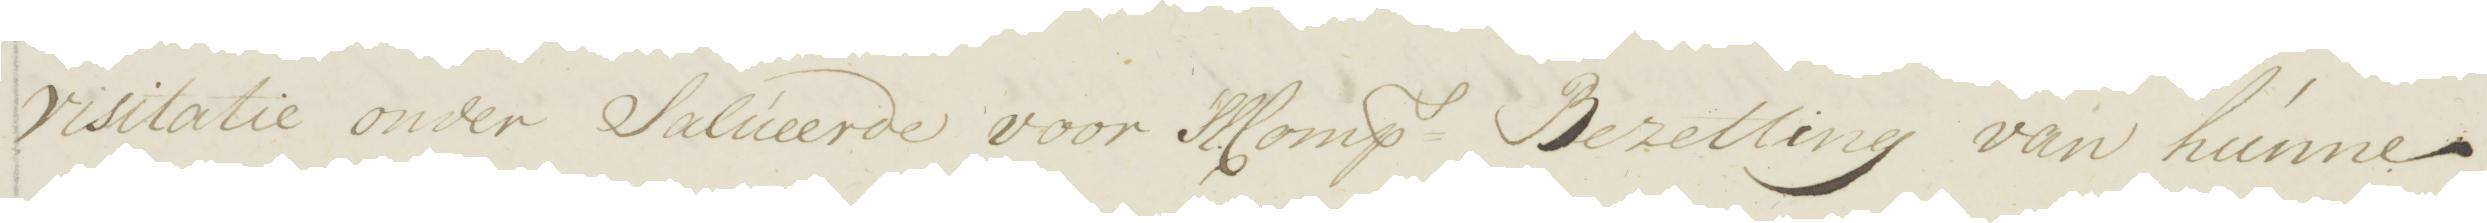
visitatie onder salueerde voor 'sEComp=s Bezetting van hunne
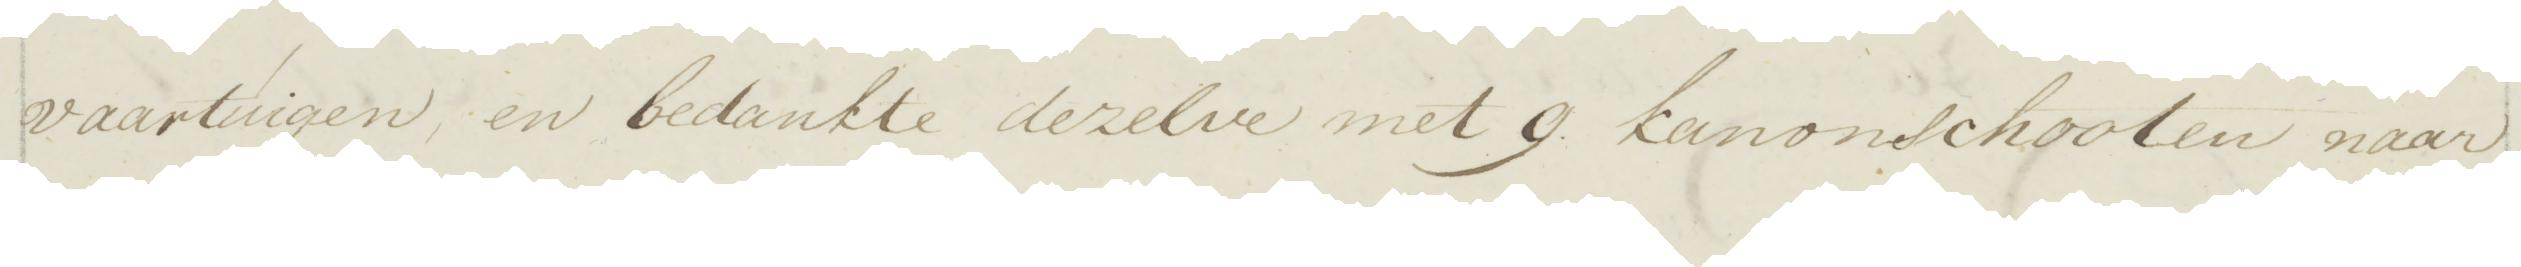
vaartuigen, en bedankte dezelve met 9. kanonschooten naar
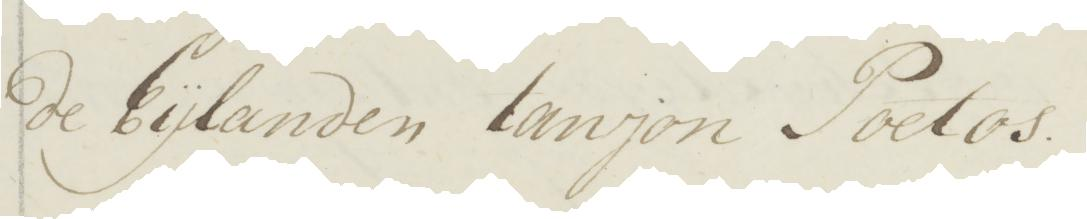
de Eijlanden tanjon Poetos.
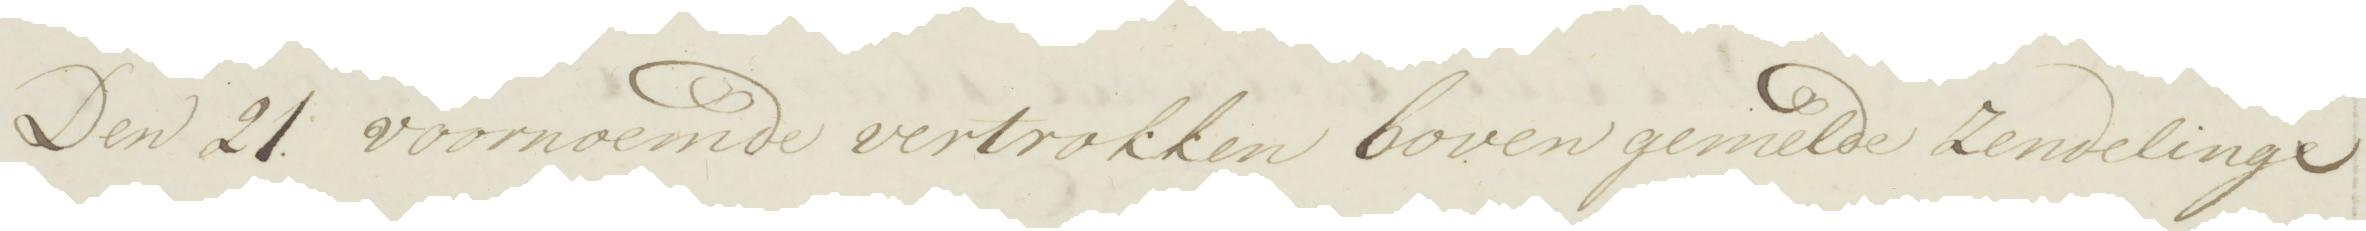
Den 21: voornoemde vertrokken boven gemelde zendelinge
